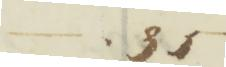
-. 35
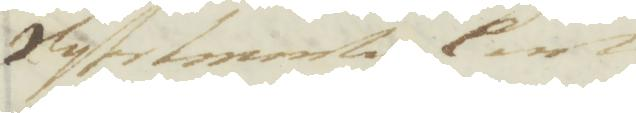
Vijf twintig Cents
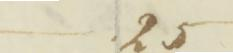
-. 25
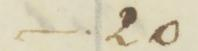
-. 20
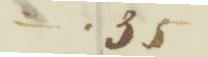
-.35
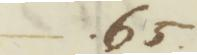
-.65
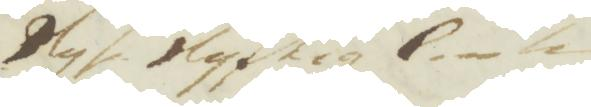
Vijf vijftig Cents
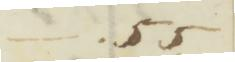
-.55
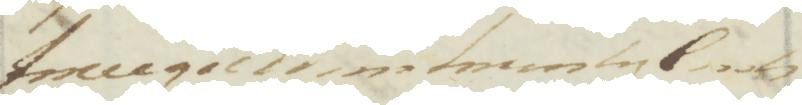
Twee guldens twintig Cents
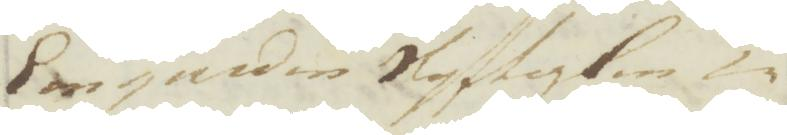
Een gulden Vijftig Cent
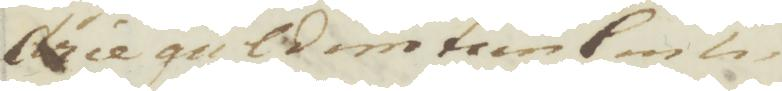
Drie gulden tien Cents
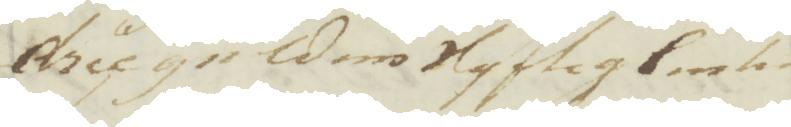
drie guldens Vijftig Cent
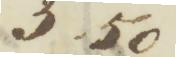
3.50
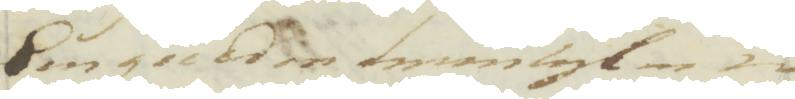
Een guldens twintig Cents
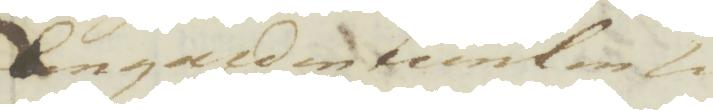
Een gulden tien Cent.
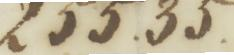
255.35
